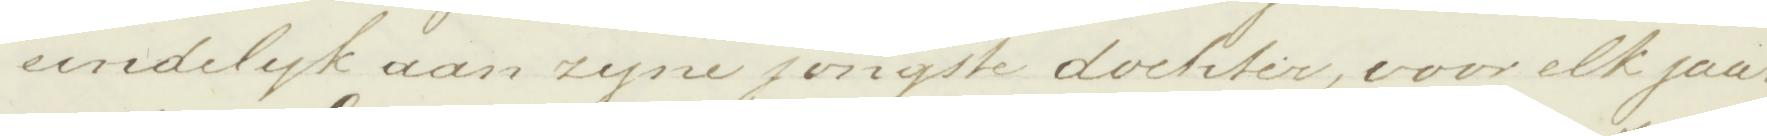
eindelyk aan zyne jongste dochter, voor elk jaar
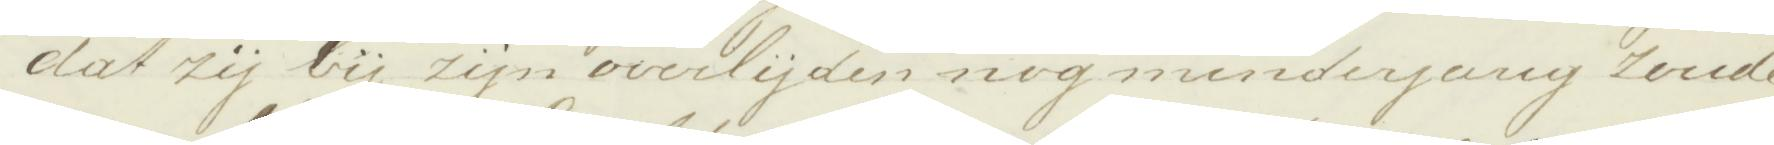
dat zij bij zijn overlijden nog minderjarig zoude
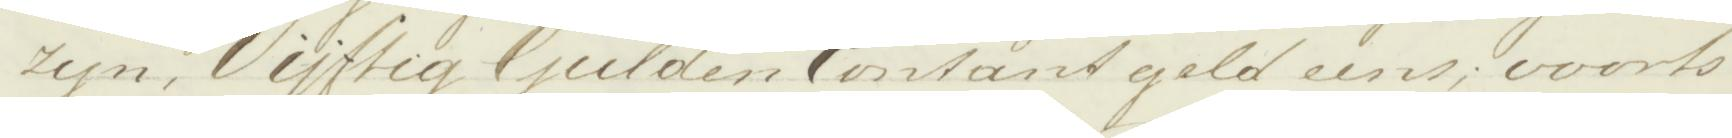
zyn, Vijftig Gulden Contant geld eens; voorts
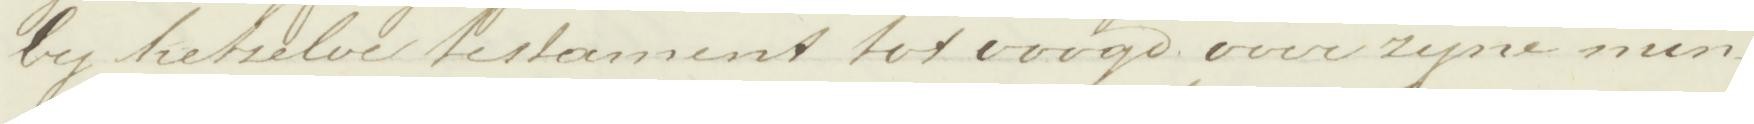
by hetzelve Testament tot voogd voor zyne min-
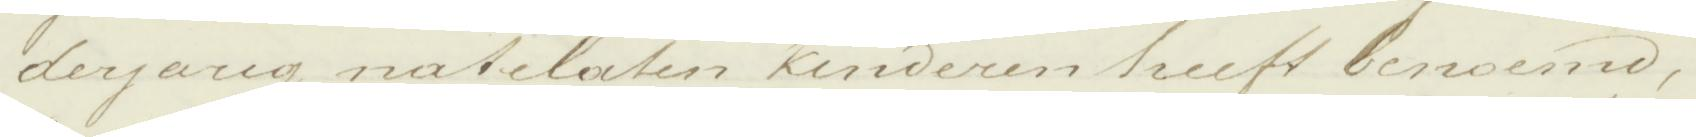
derjarig natelaten kinderen heeft benoemd,
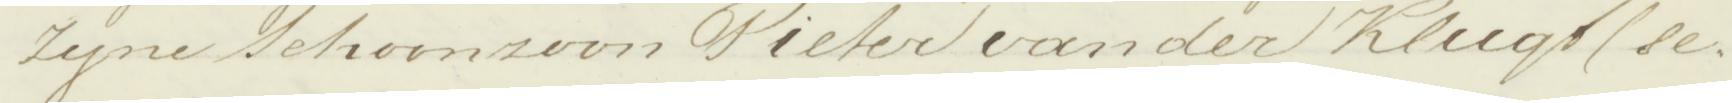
zyne schoonzoon Pieter van der Klugt (se„
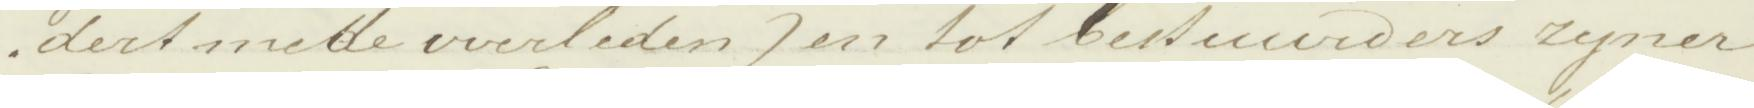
„dert mede overleden) en tot bestuurders zyner
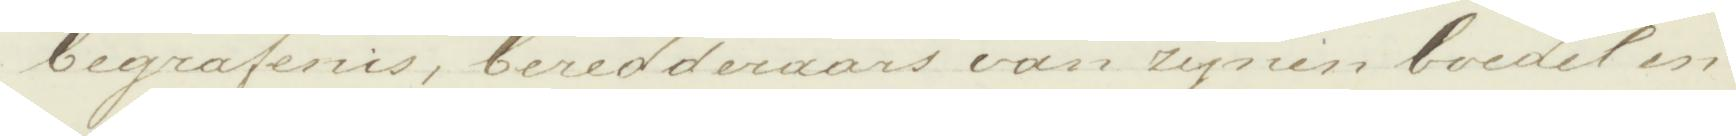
begrafenis, beredderaars van zynen boedel en
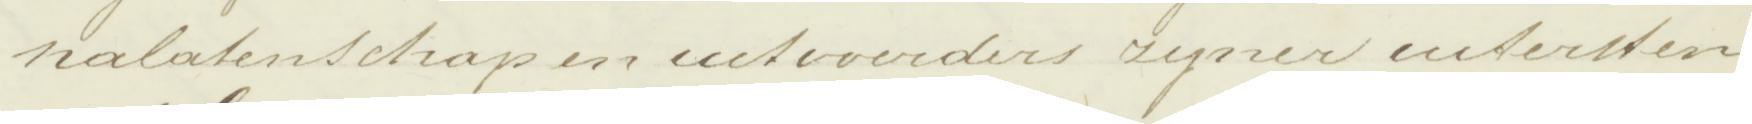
nalatenschap en uitvoerders zyner uitersten
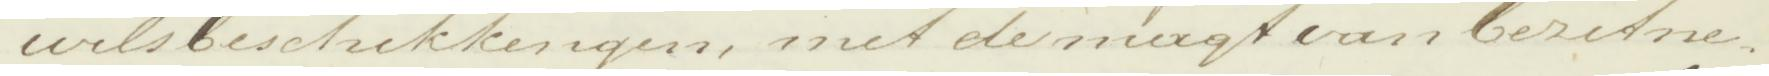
wils beschikkingen, met de magt van bezitne.
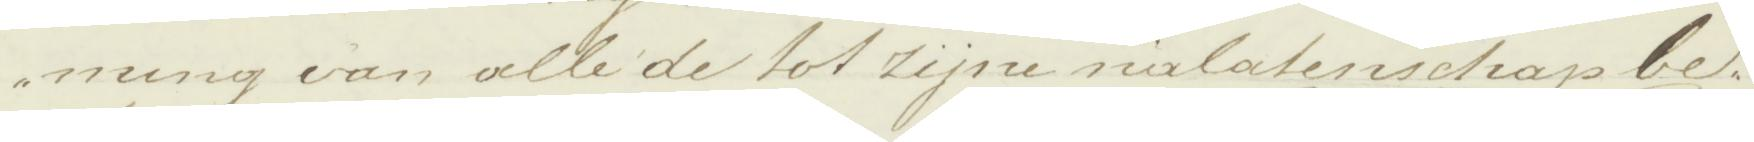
„ming van alle de tot zijne nalatenschap be„
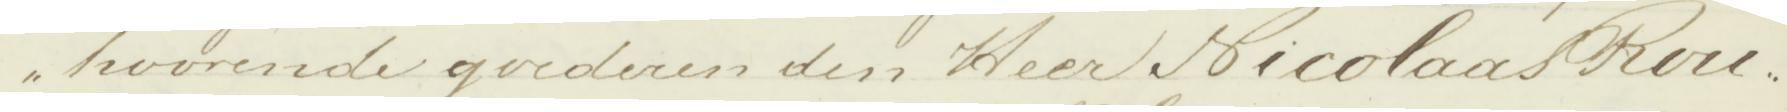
„hoorende goederen den Heer Nicolaas Rou„
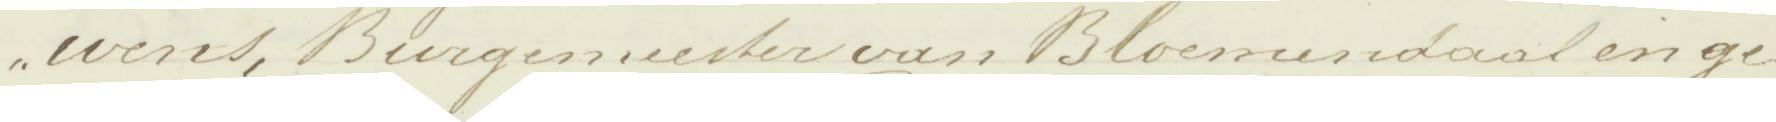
„wens, Burgemeester van Bloemendaal en ge
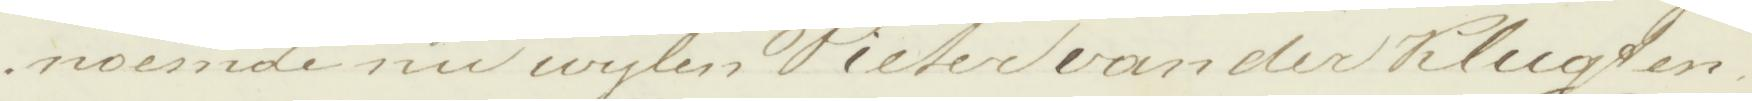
„noemde nu wylen Pieter van der Klugten,
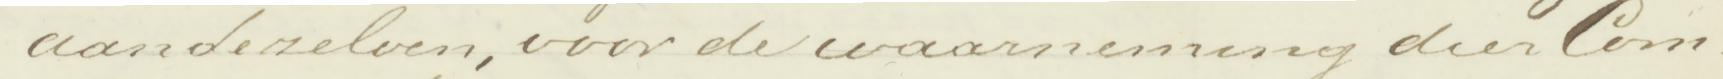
aandezelven, voor de waarneming dier Com„
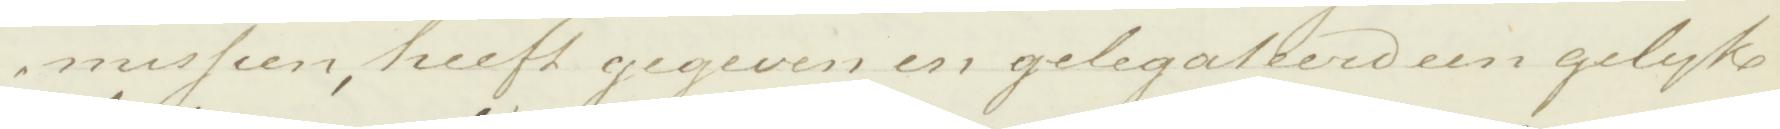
„missien, heeft gegeven en gelegateerd een gelyk
